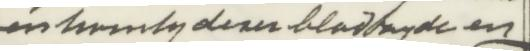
en twintig dezer bladzyde en
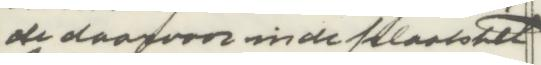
de daarvoor in de plaatstel
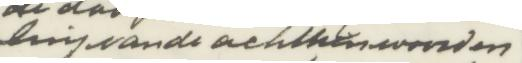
ling van de achttien woorden
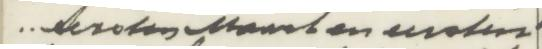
.. eersten Maart en eersten
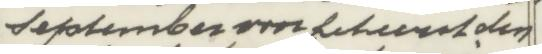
September voor het eerst den
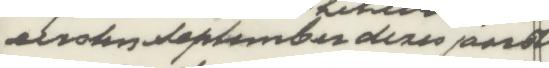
eersten September dezes jaars
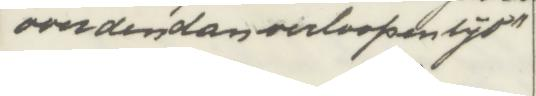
over den dan verloopen tijd"
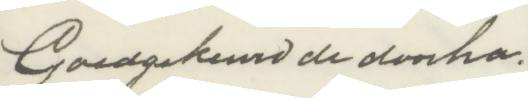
Goedgekeurd de doorha.
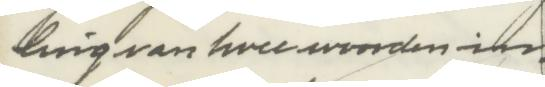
ling van twee woorden in
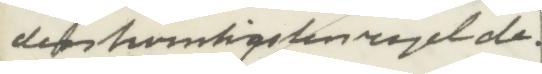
den twintigsten regel de
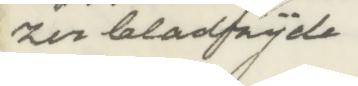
zer bladzijde
